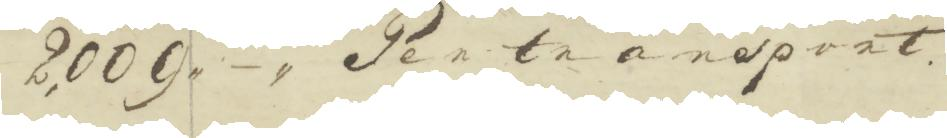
ƒ 2,009„–„ Per transport.
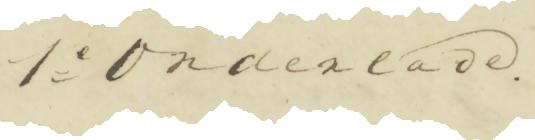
1=e onderlade.
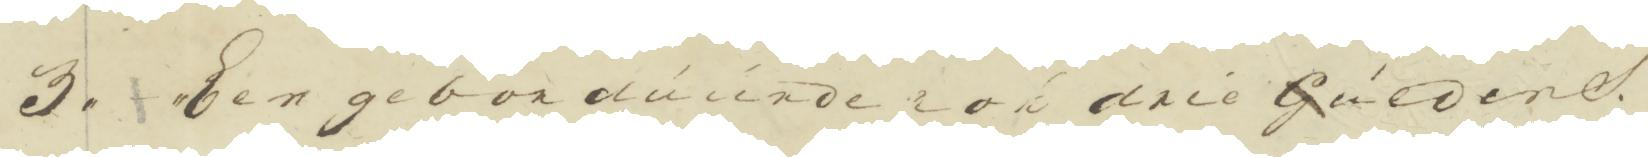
3„ – „ Een geborduurde rok drie Guldens.
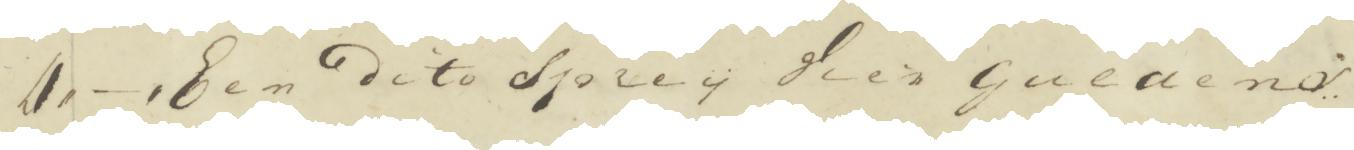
„ 4„ – „ Een dito spreij Vier Guldens.
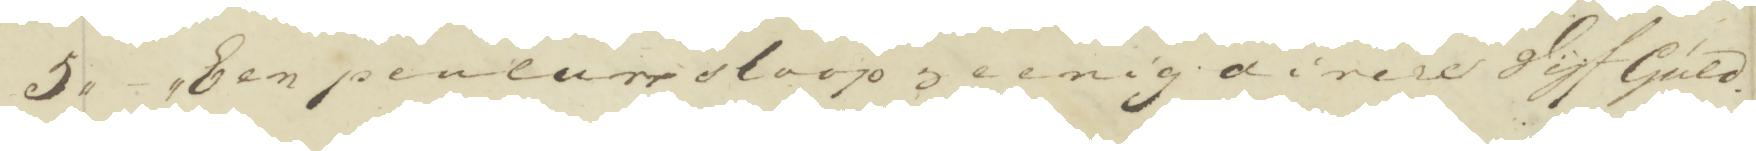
„ 5„ – „ Een penluwsloop en eenig divere Vijf Guld.
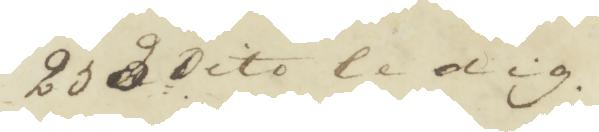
250 dito ledig.
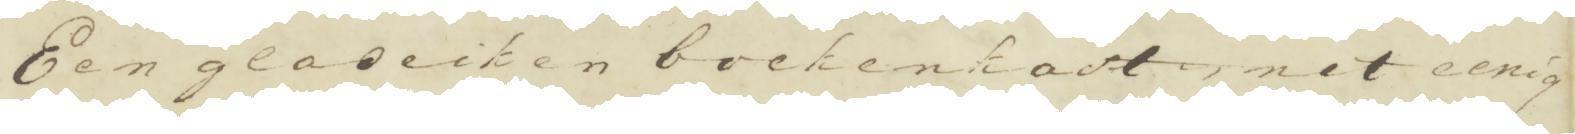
Een gladeiken boekenkast met eenig
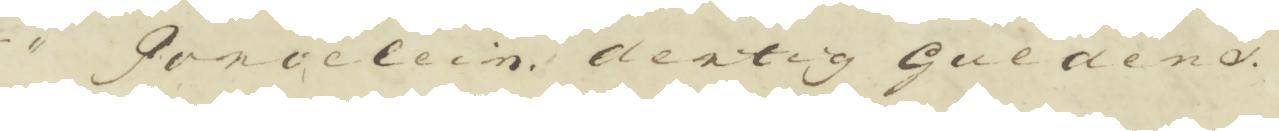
„ 30„ – „ porcelein. dertig Guldens.
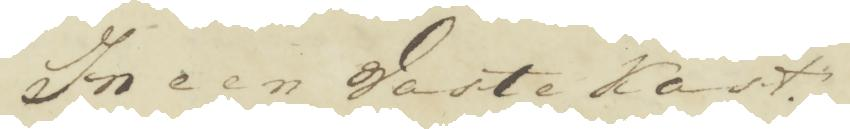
Jn een Vaste kast.
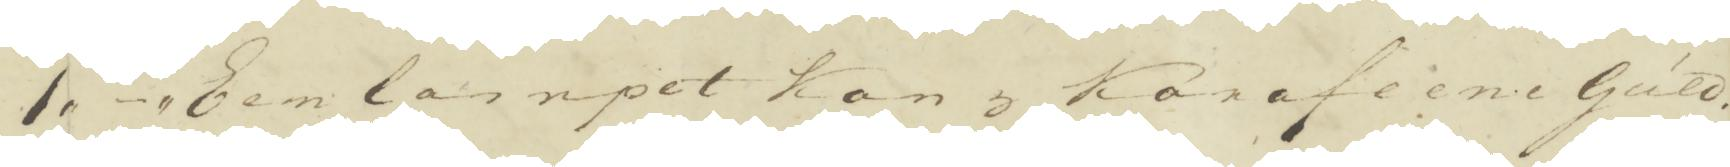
1„ – „ Een lampetkan kann en Karaf eene Guld.
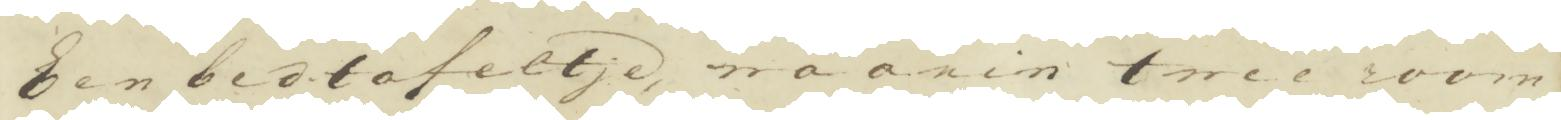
Een bedtafeltje, waarin twee room
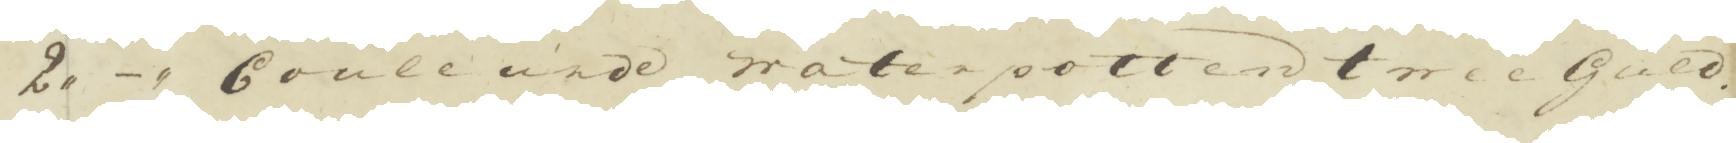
2„ – „ Couleurde waterpotten twee Guld.
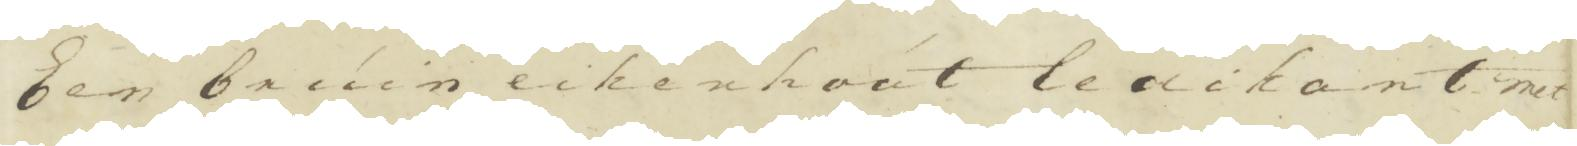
Een bruin eikenhout ledikant met
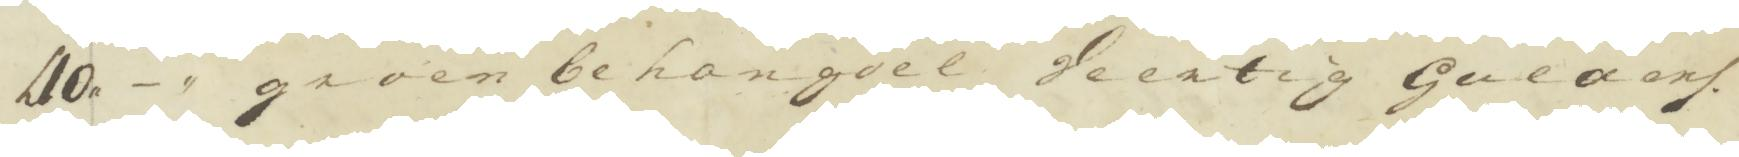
40„ – „ groen behangsel Veertig Guldens.
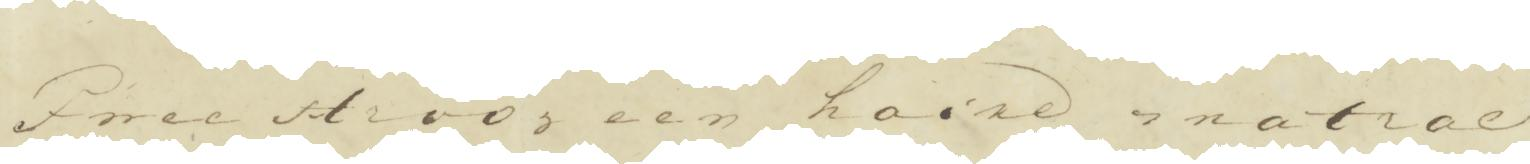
Twee stroo en een haire matral
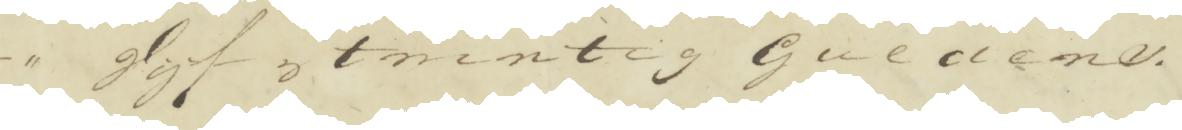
„ 25„ – „ Vijf en twintig Guldens.
